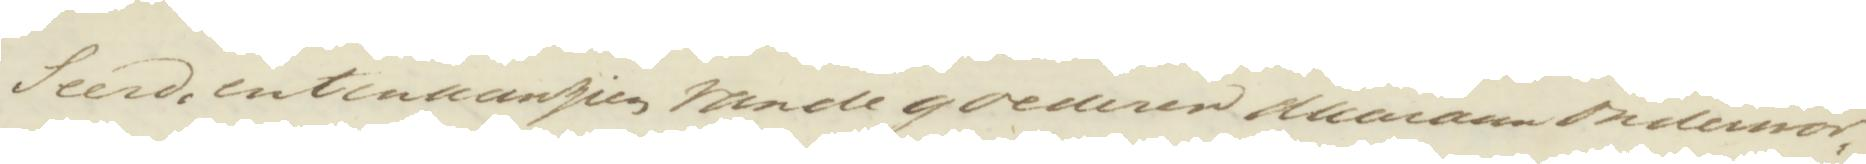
seerd, en ten aanzien van de goederen daaraan onderwor„
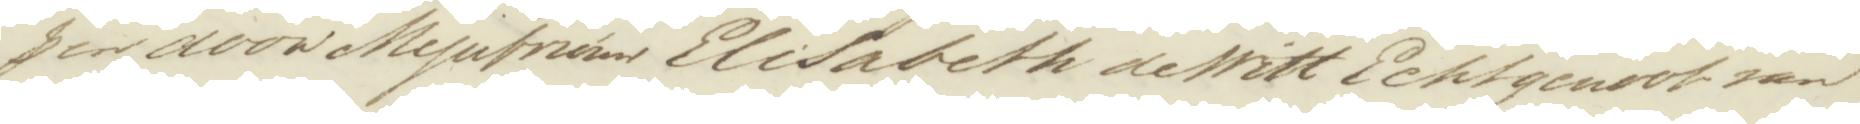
pen door Mejufrouw Elisabeth de Witt Echtgenoot van
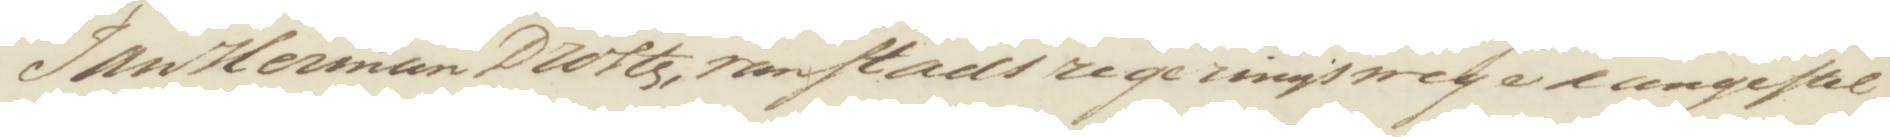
Jan Herman Droste, van Stads regerings wege aangestel
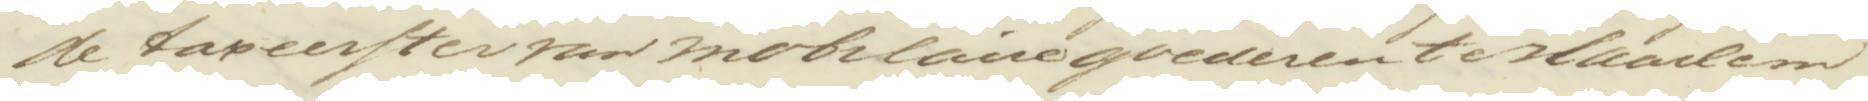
de taxeerster van mobilaire goederen te Haarlem
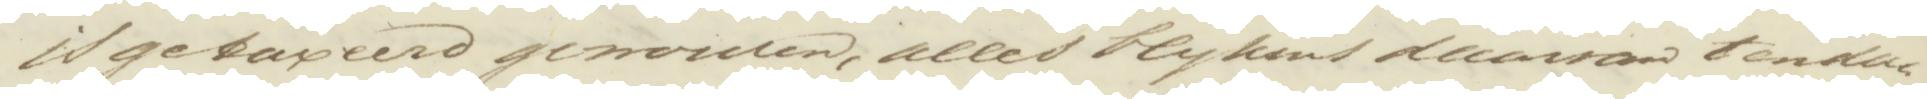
is getaxeerd geworden, alles blykens daarvan ten da„
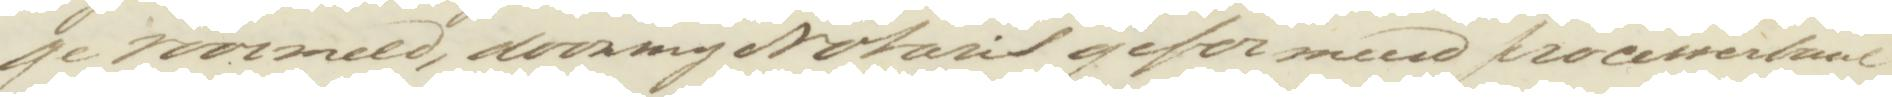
ge voormeld, door my Notaris geformeerd procesverbaal
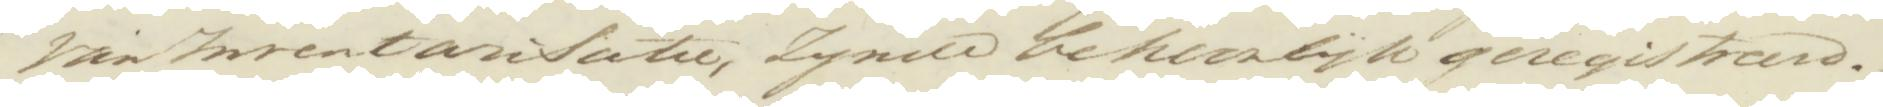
van Inventarisatie, Zynde behoorlijk geregistreerd.
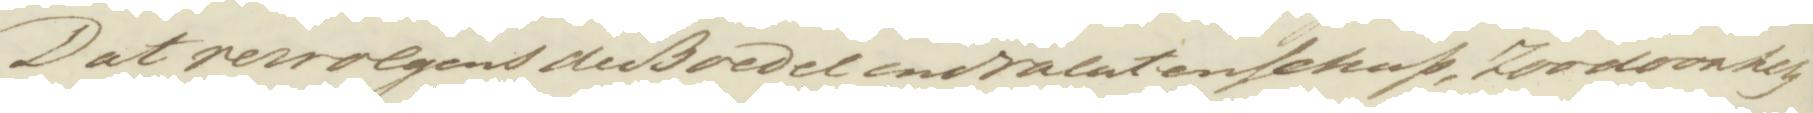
Dat vervolgens de Boedel en Nalatenschap, Zoo door het
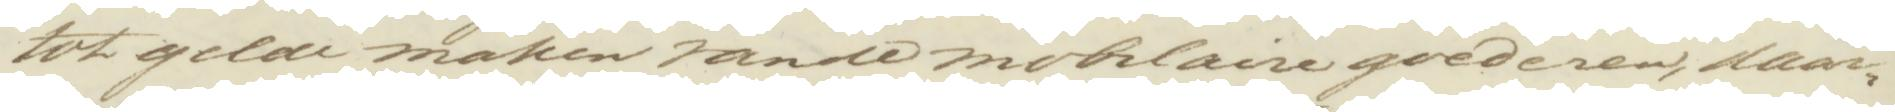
tot gelde maken van de mobilaire goederen, daar„
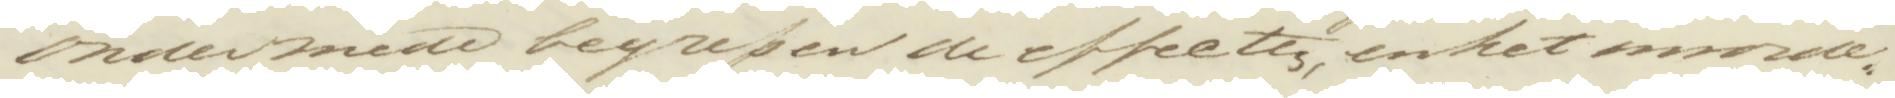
ondermede begrepen de effecten, en het invorde„
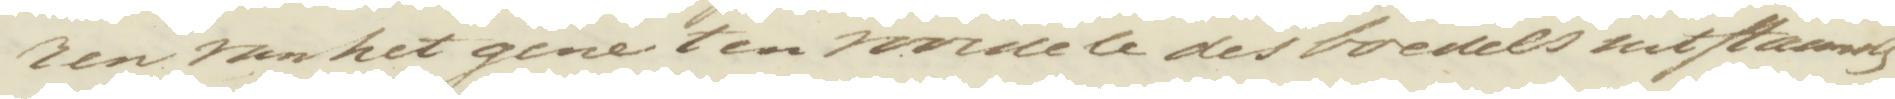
ren van het gene ten voordele des boedels uitstaande
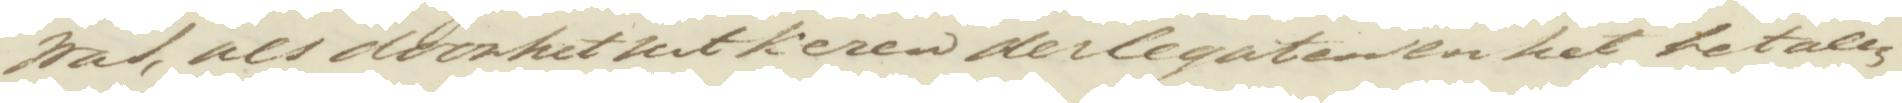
was, als door het uitkeren der legaten en het betalen
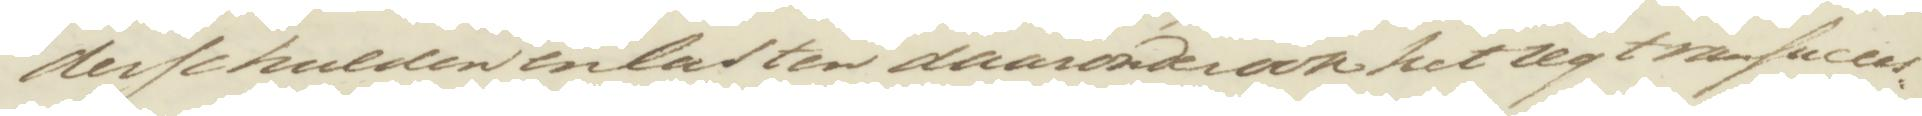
der schulden en lasten daaronder ook het regt van succes„
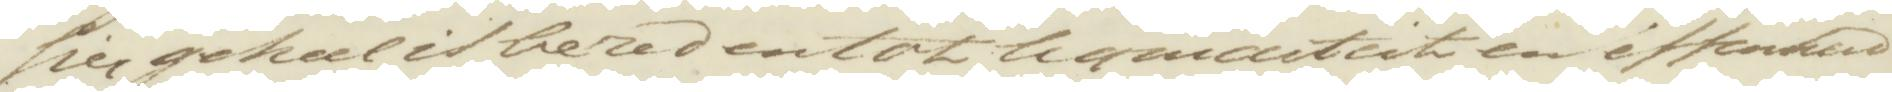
sie geheel is bered en tot liquiditeit en effenheid
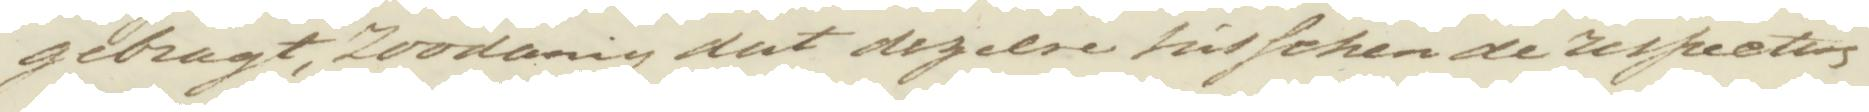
gebragt, Zoodanig dat dezelve tusschen de respective
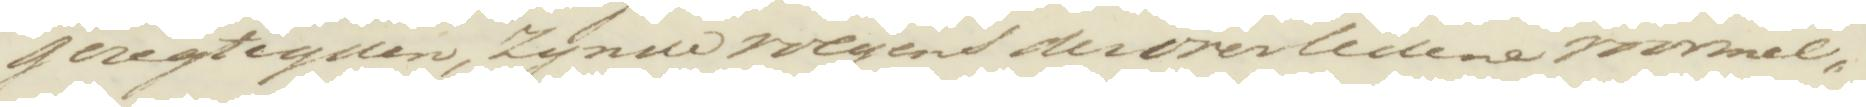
geregtigden, Zynde volgens der overledene voormel„
